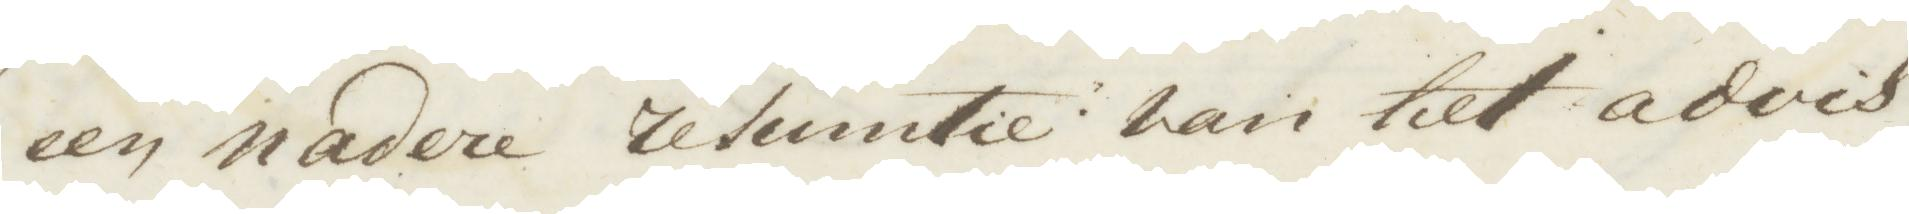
een nadere resumtie van het advis
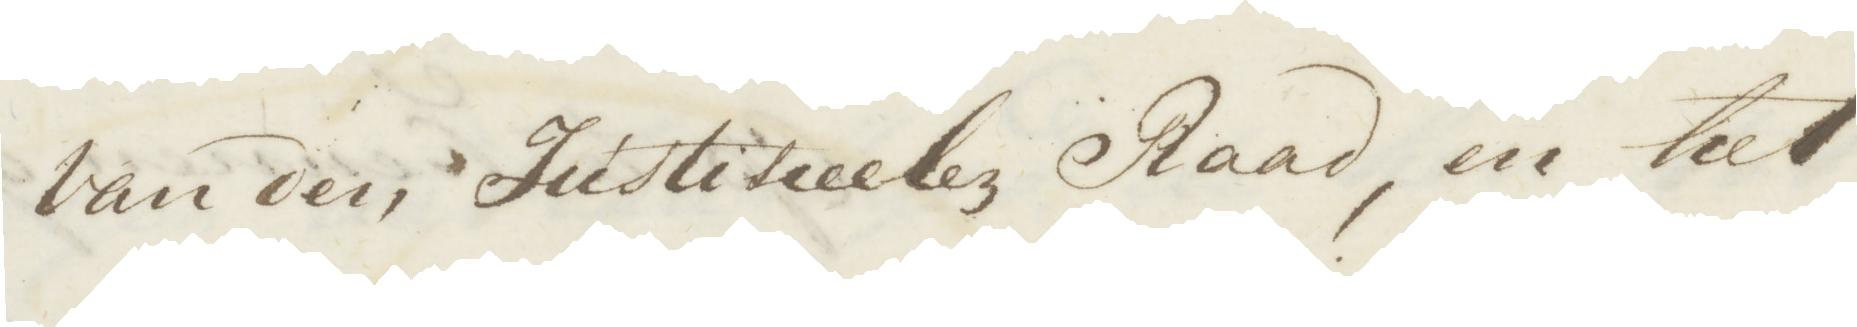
van den Justitieelen Raad, en het
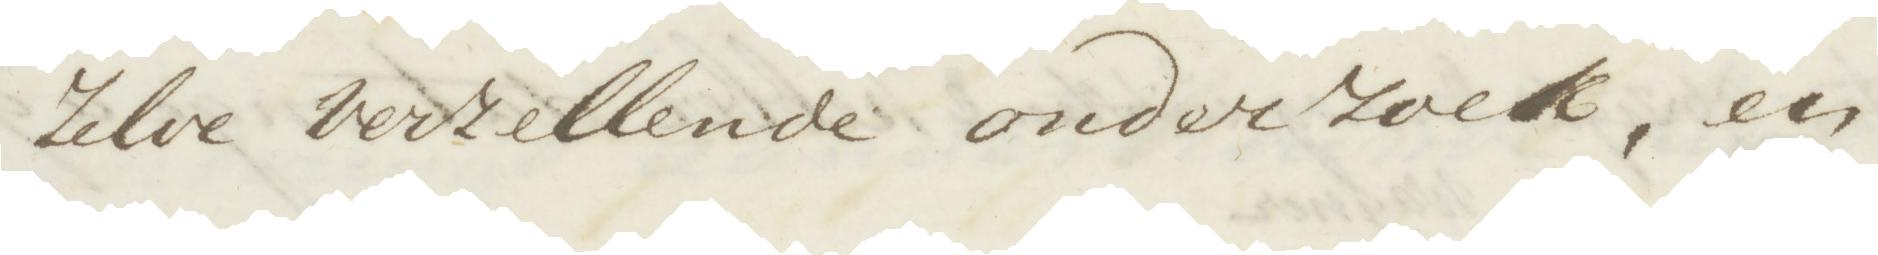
zelve verzellende onderzoek, en
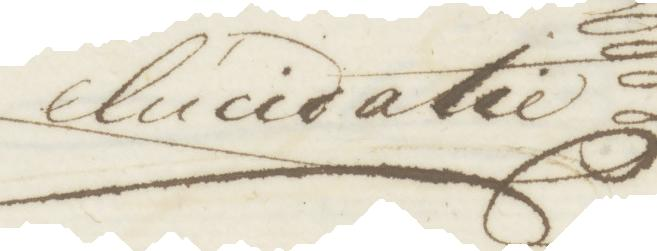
elucidatie
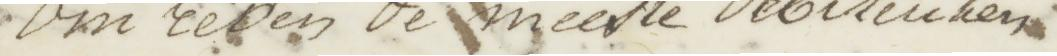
om reden de meeste debiteuren
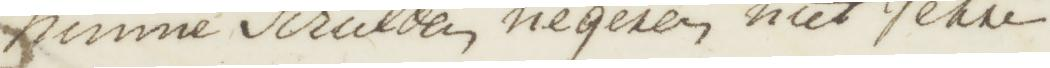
hunne schulden negeren niet verre
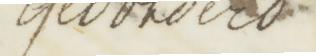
gevorderd
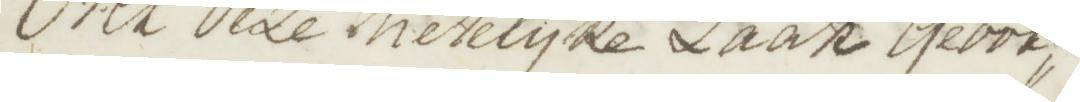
Over deze netelijke zaak geoor„
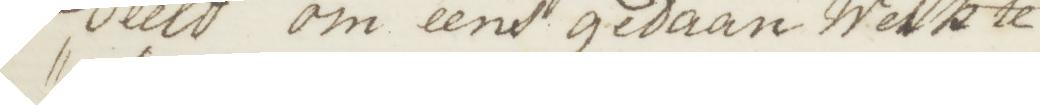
„deeld om eens gedaan werk te
